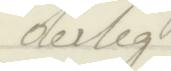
derteg
